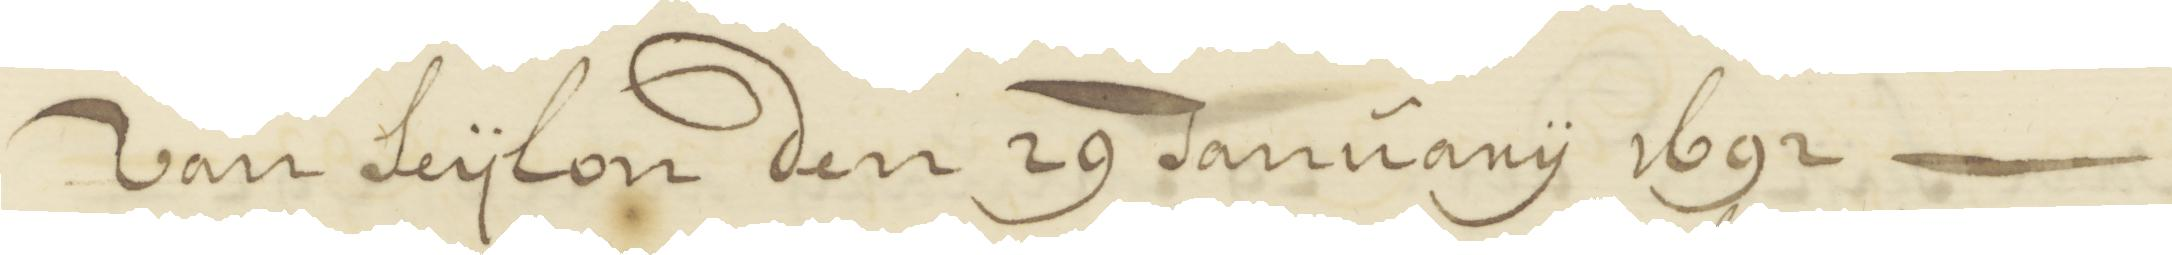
Van Seijlon den 29 Ianuarij 1692 —
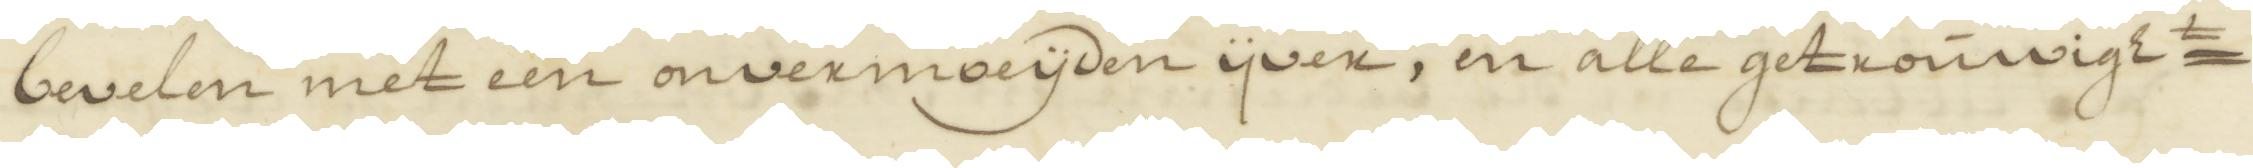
bevelen met een onvermoeijden ijver, en alle getrouwigh=t
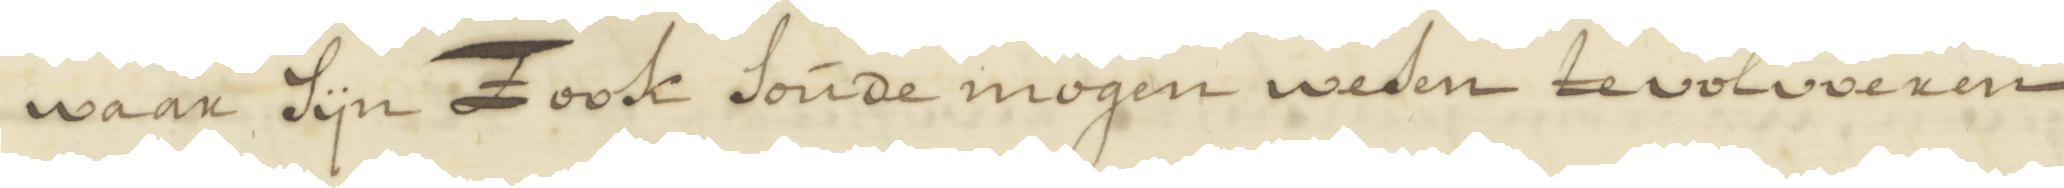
waar sijn E ook soude mogen wesen te volweren
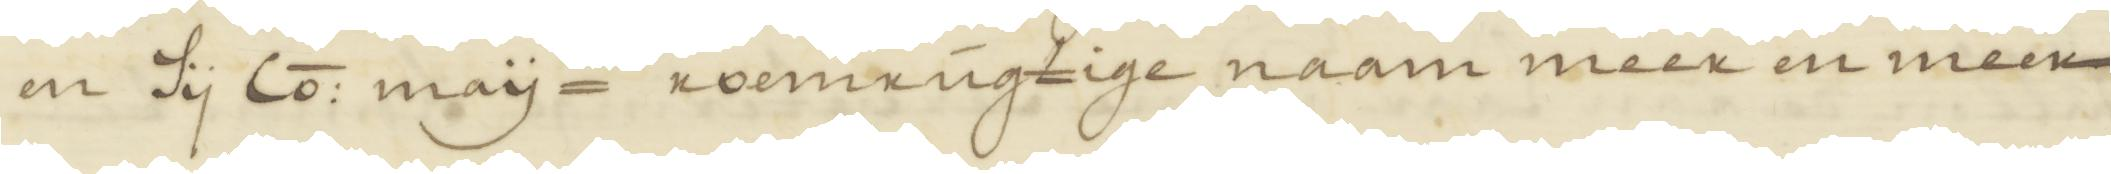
en sij Co: maij=ts roemrugtige naam meer en meer
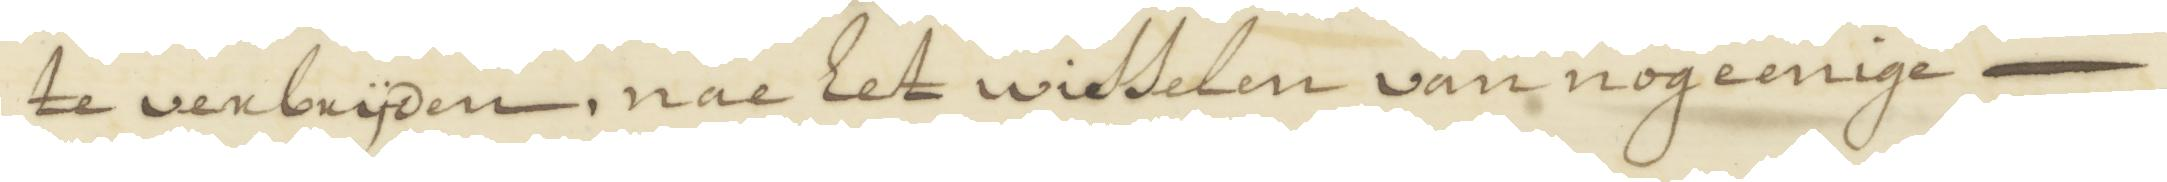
te verbrijden, nae het wisselen van nog eenige —
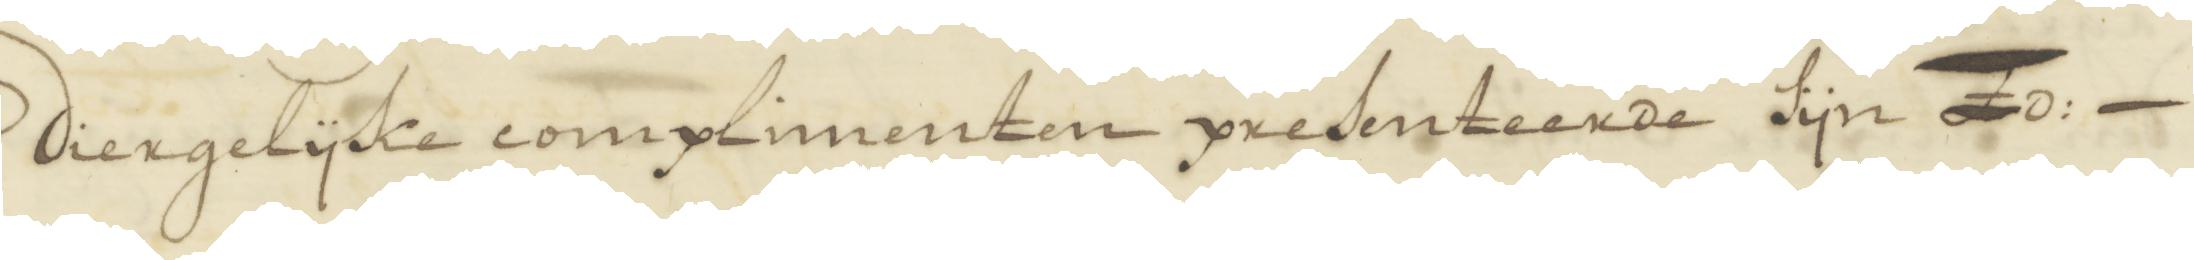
diergelijke complimenten presenteerde sijn Ed: —
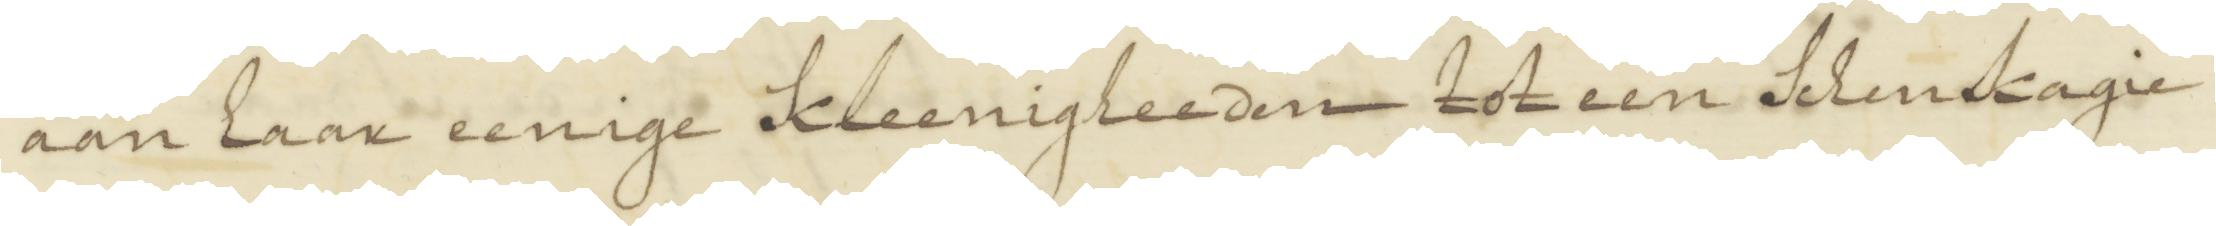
aan haar eenige kleenigheeden tot een schenkagie
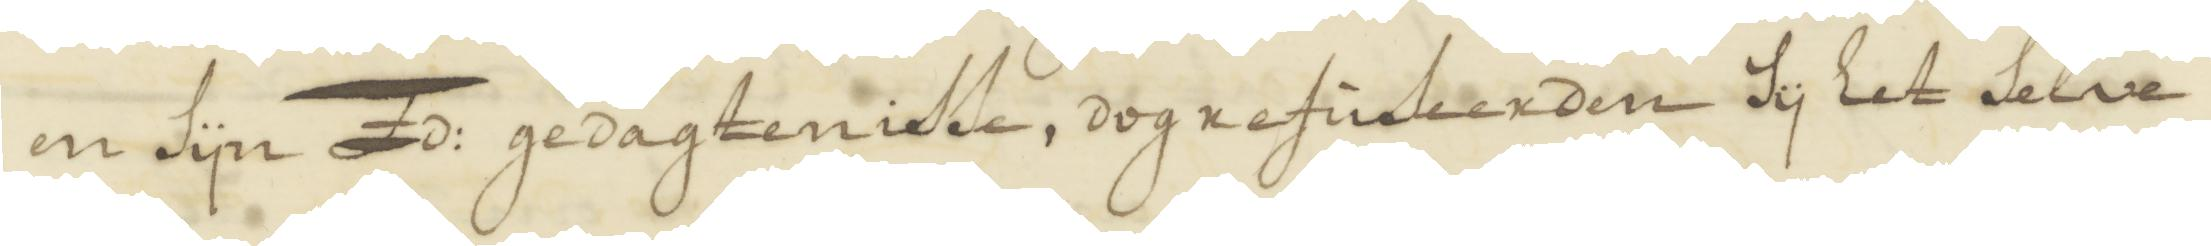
en sijn Ed: gedagtenisse, dog refuseerden sij het selve
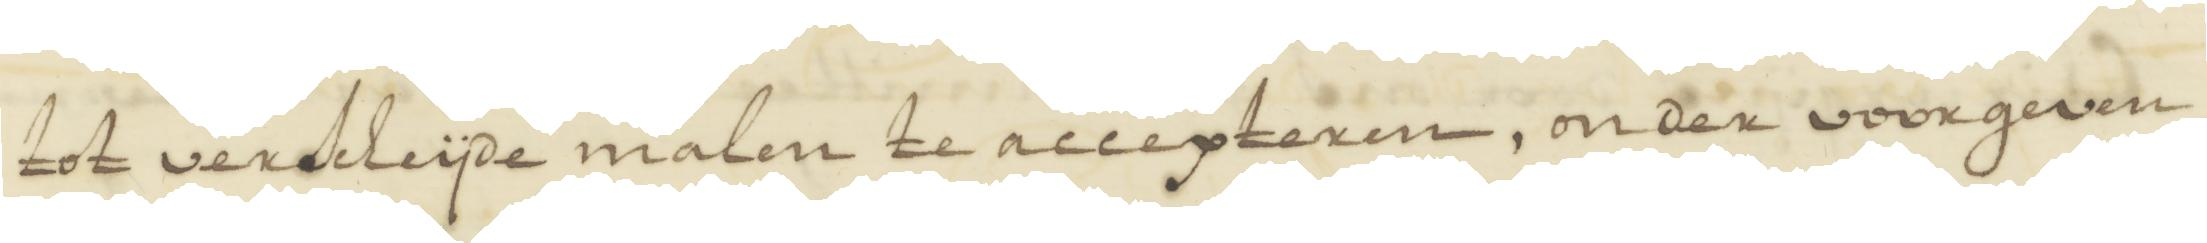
tot verscheijde malen te accepteren, onder voorgeven
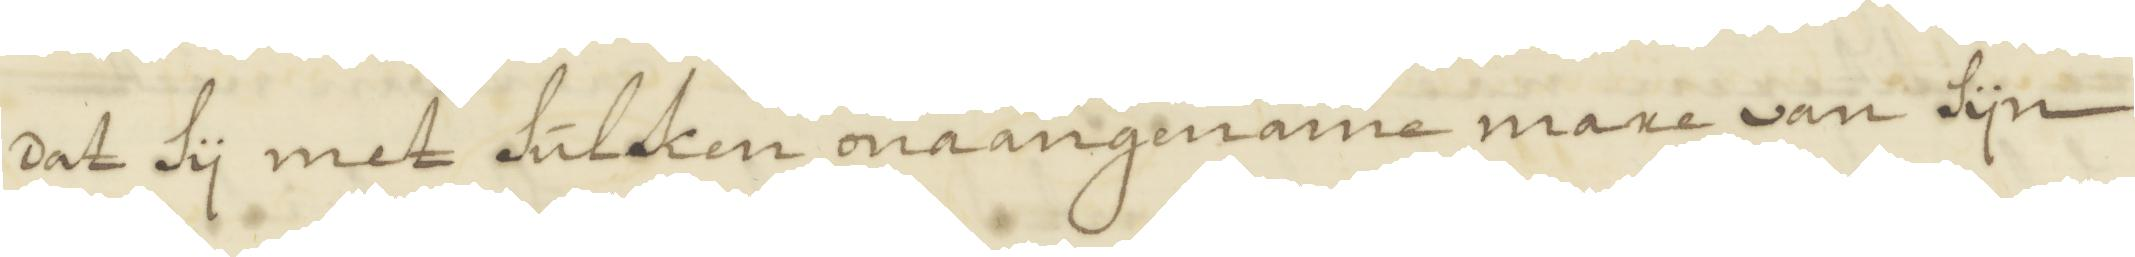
dat sij met sulken onaangename mare van sijn
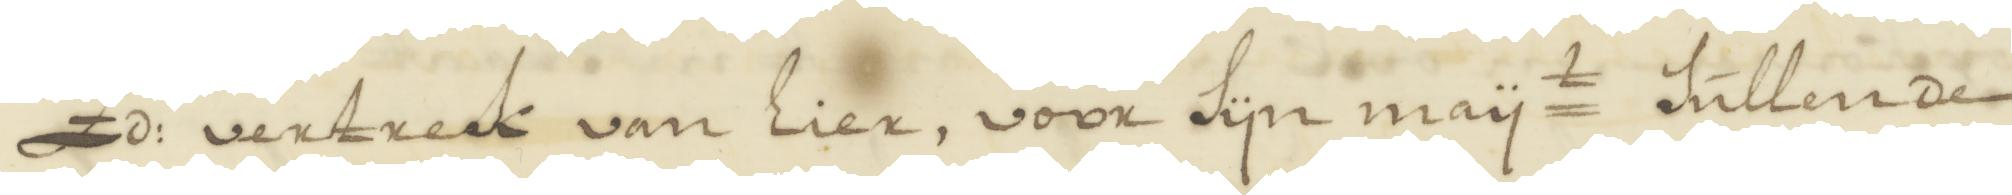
Ed: vertrek van hier, voor sijn maij=t sullende
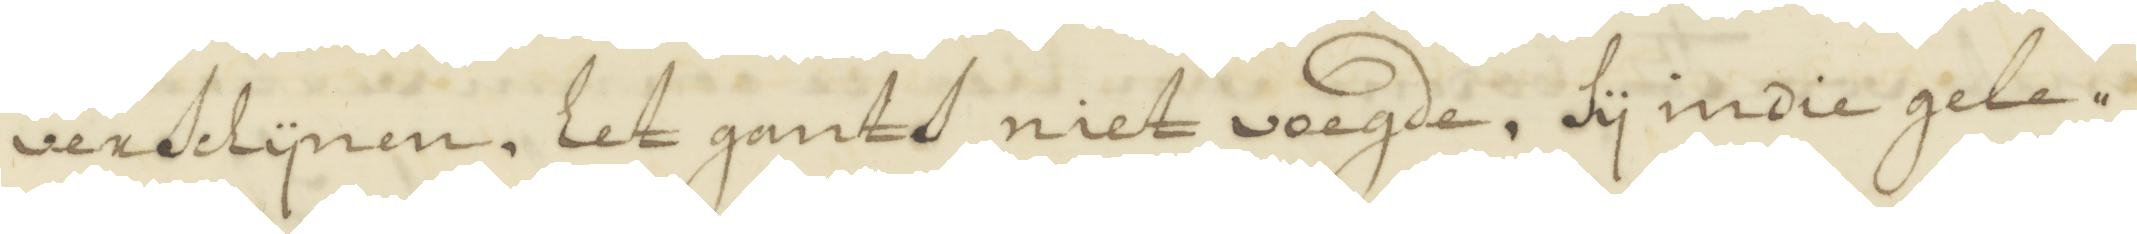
verschijnen, het gants niet voegde, sij in die gele„
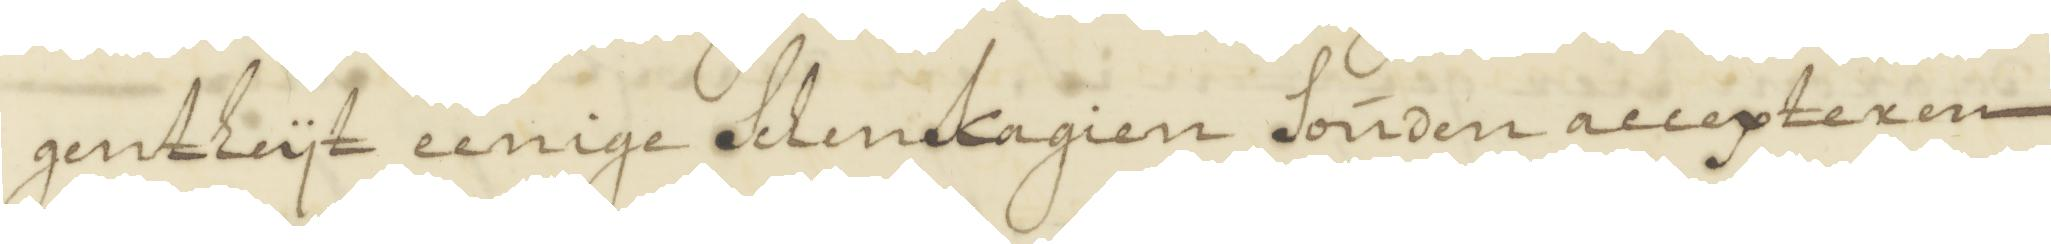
gentheijt eenige schenkagien souden accepteren
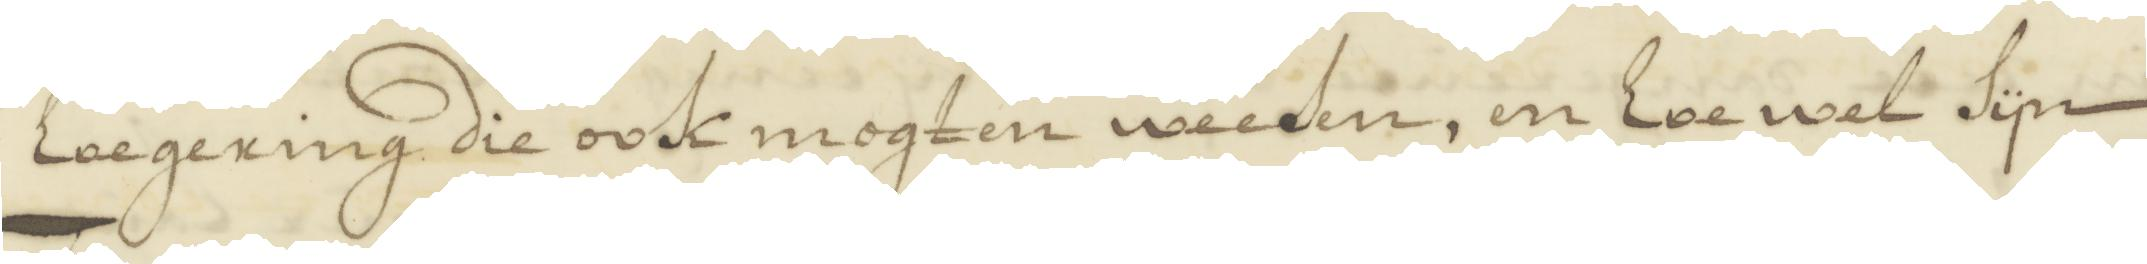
hoe gering die ook mogten weesen, en hoe wel sijn
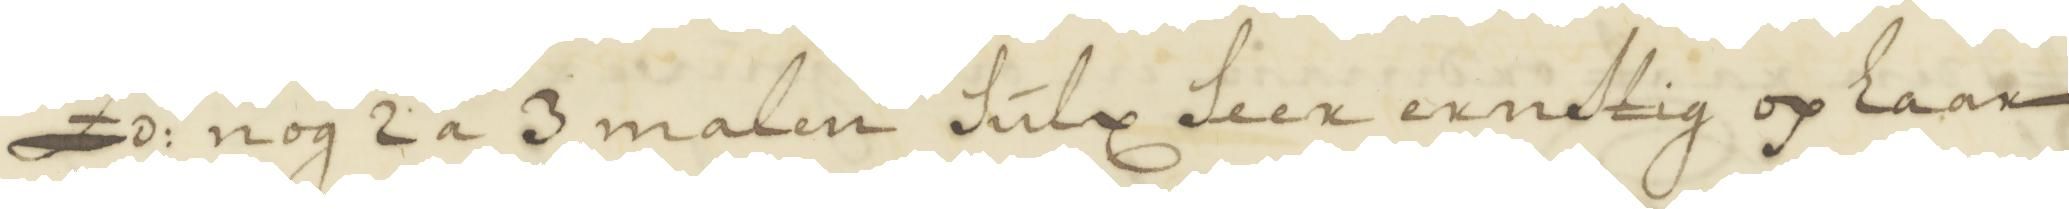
Ed: nog 2 a 3 malen sulx seer ernstig op haar
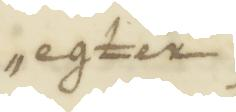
„ egter
